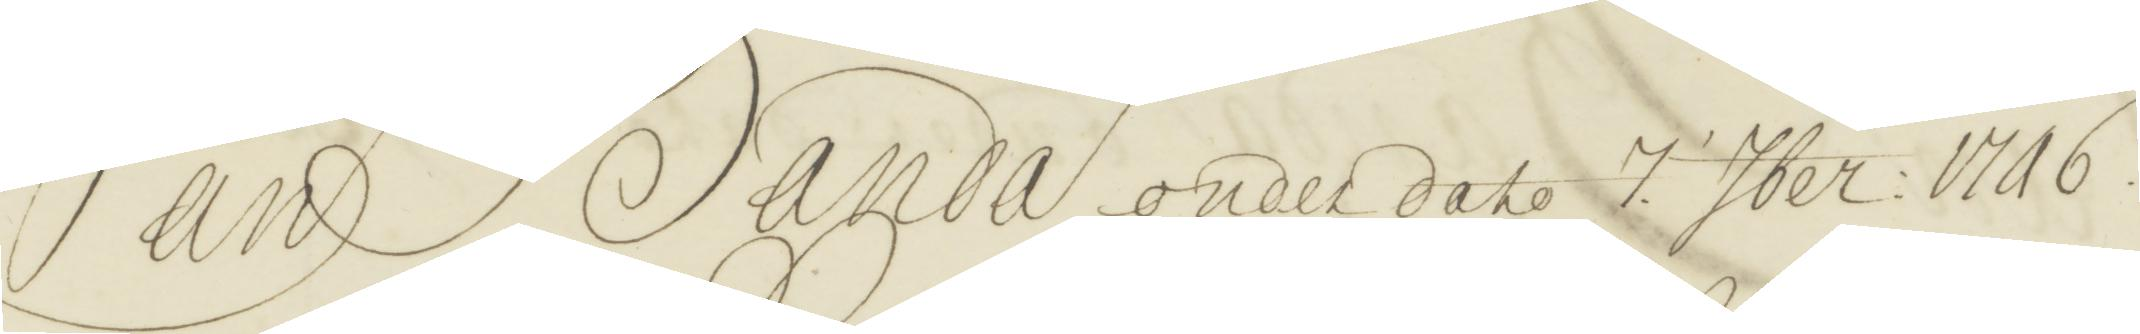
Van Banda onder dato 7:' Jber: 1746.
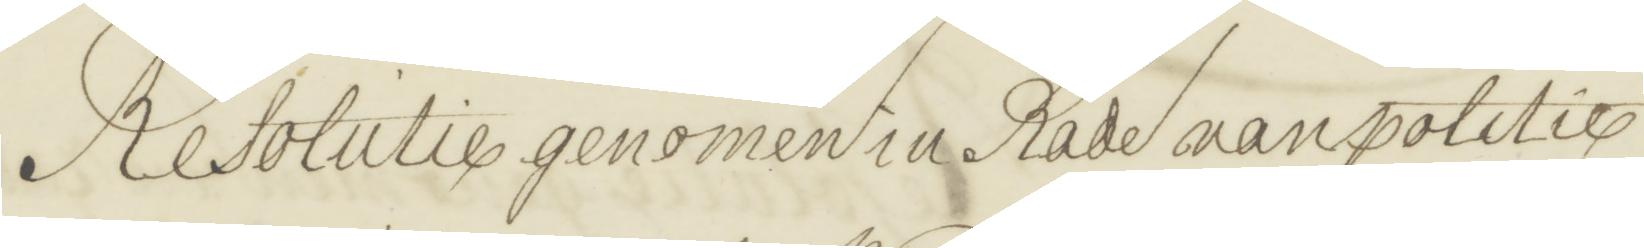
Resolutie genomen in Rade van politie
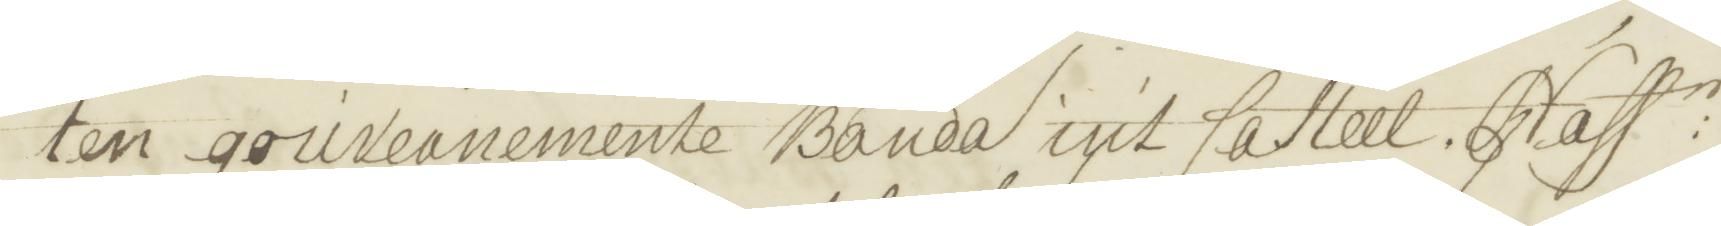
ten gouvernemente Banda in't Casteel. Nass:w
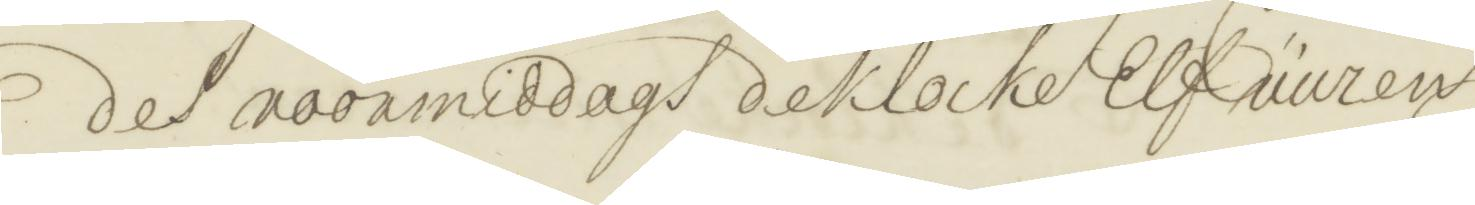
des voormiddags deklocke Elf uuren
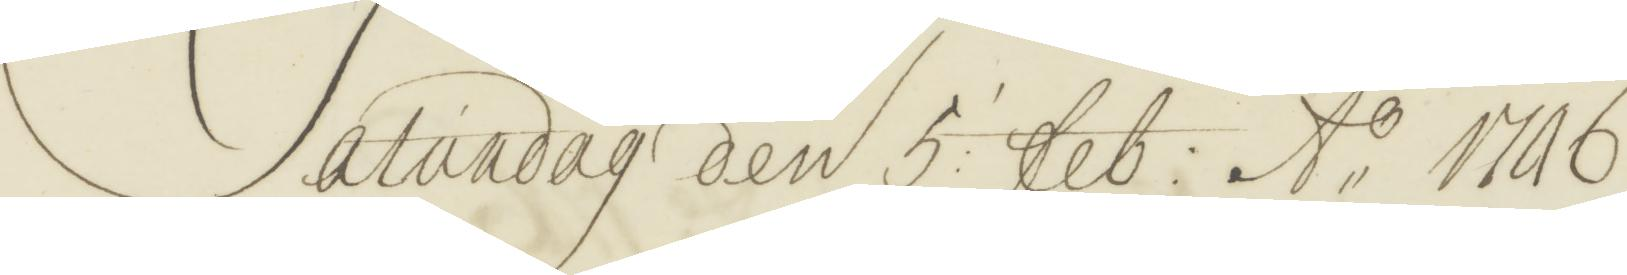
Saturdag den 5:' feb: A„o 1746
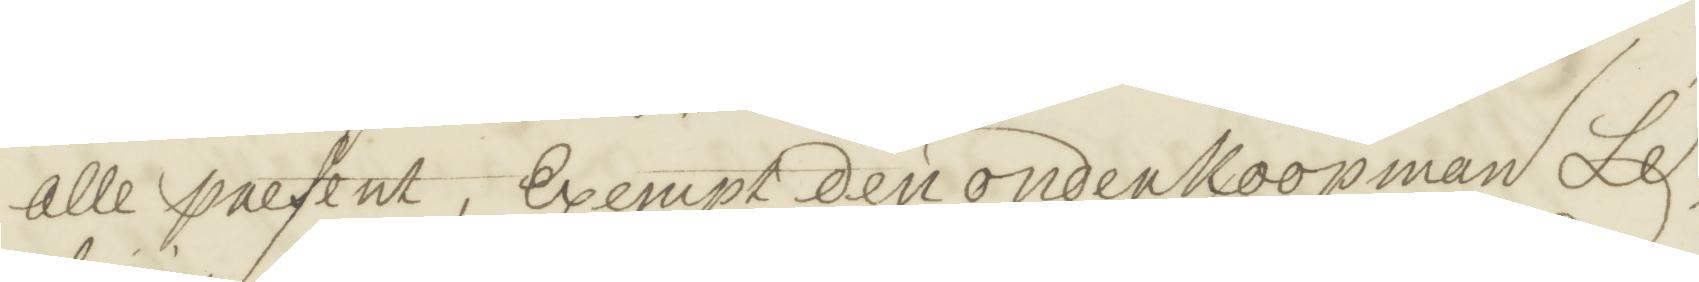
alle present, Exempt den onderkoopman Le
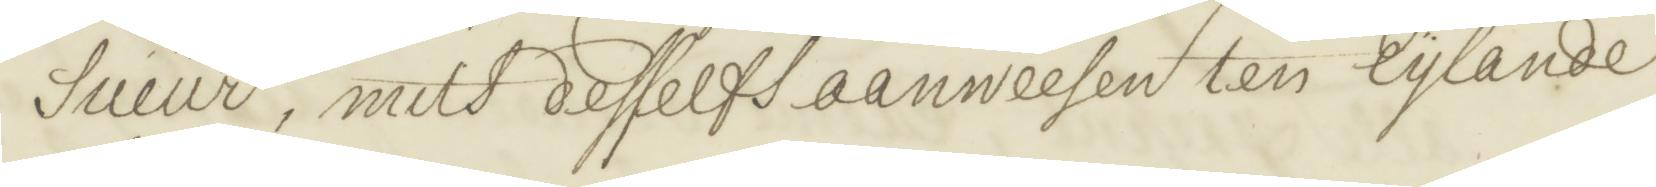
sueur, mits desselfs aanweesen ten Eijlande
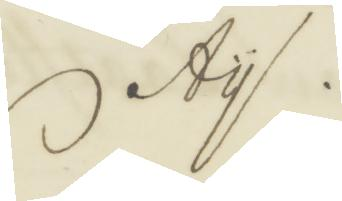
Aij.
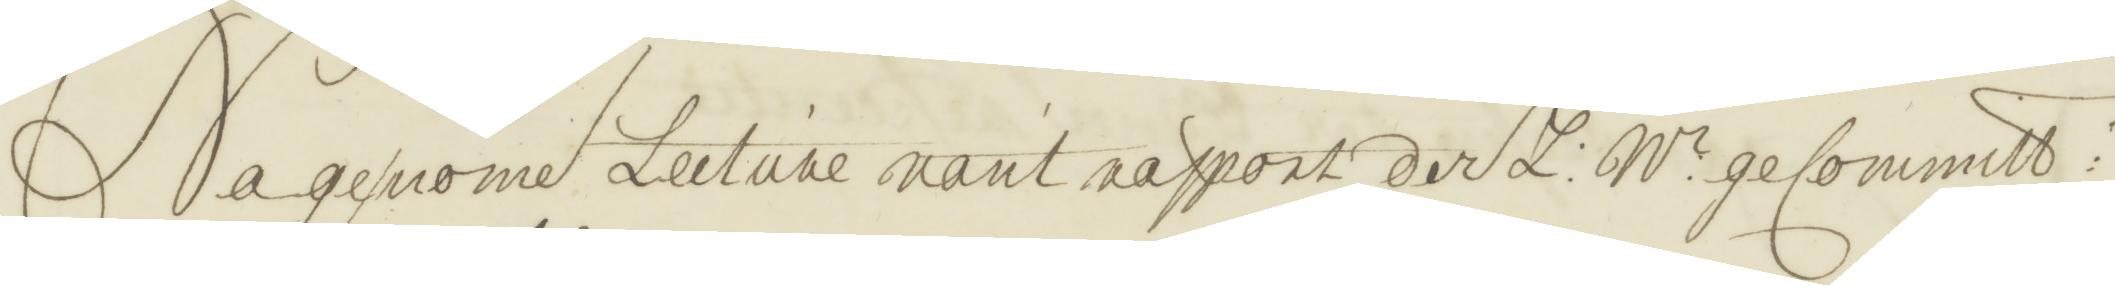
Nagenome Lecture van't rapport der Z: W:r gecommitt:
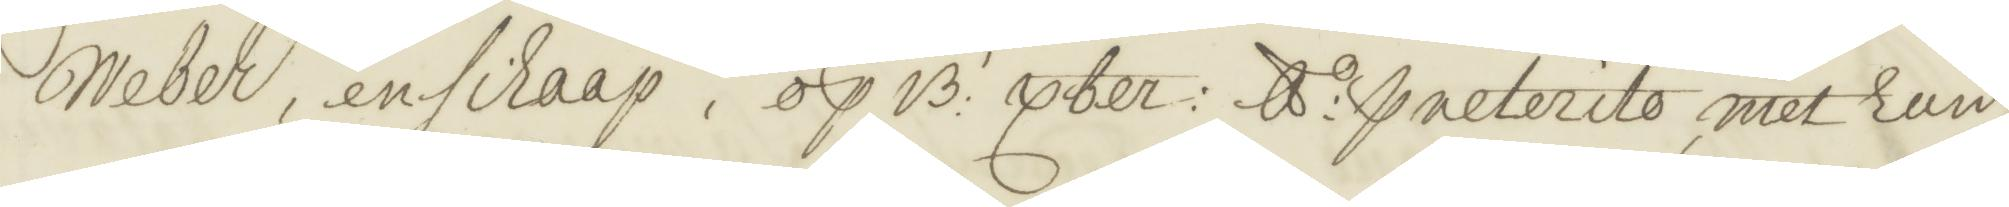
weber, en schaap, op 13:' xber: A:o preterito met hun
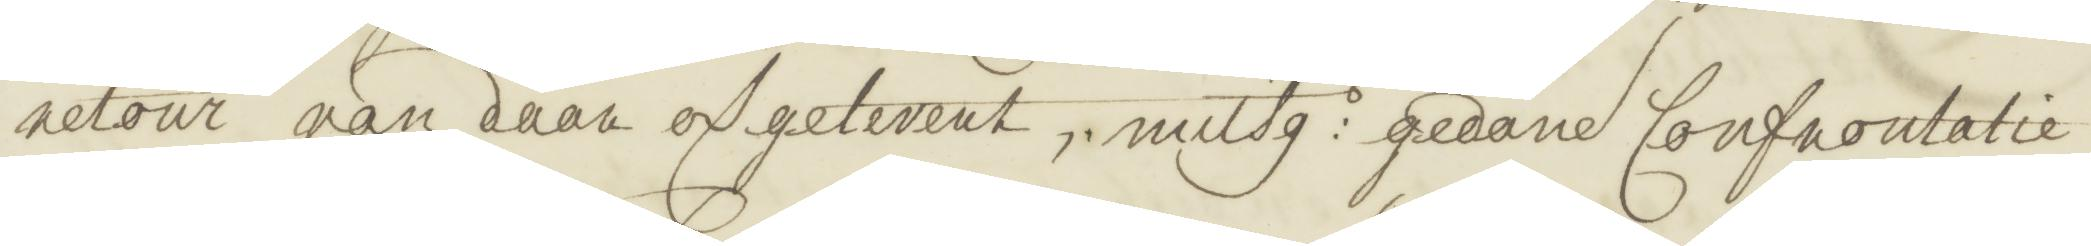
retour van daar over gelevert, mitsg:s gedane Confrontatie
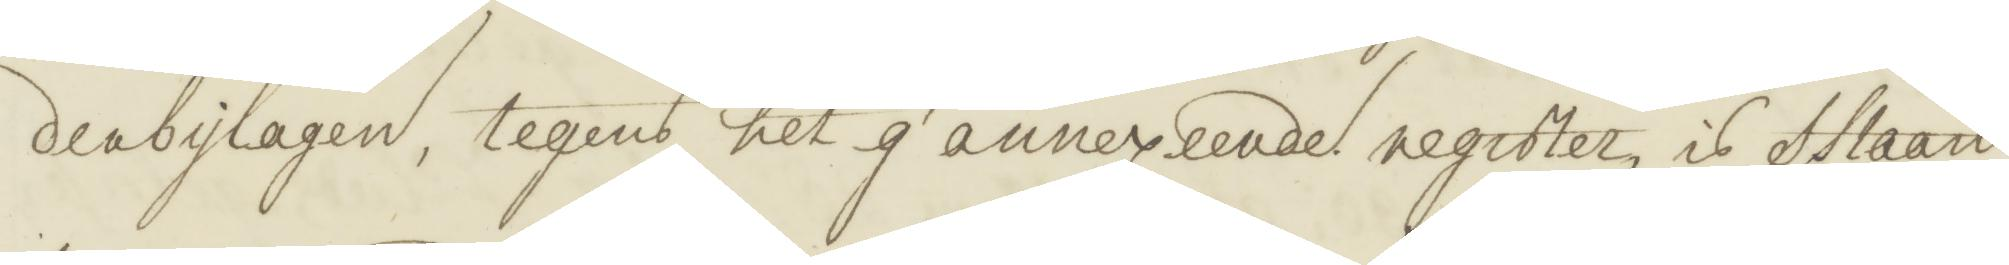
der bijlagen, tegens het g’annexeerde register is verstaan
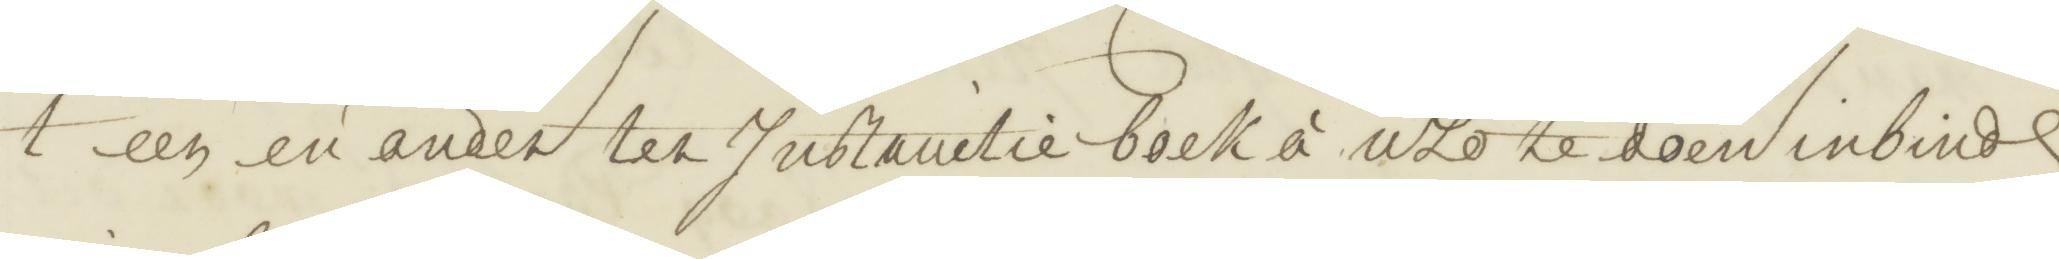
't een en ander ter Jnstructie boek à uzo te doen inbinde
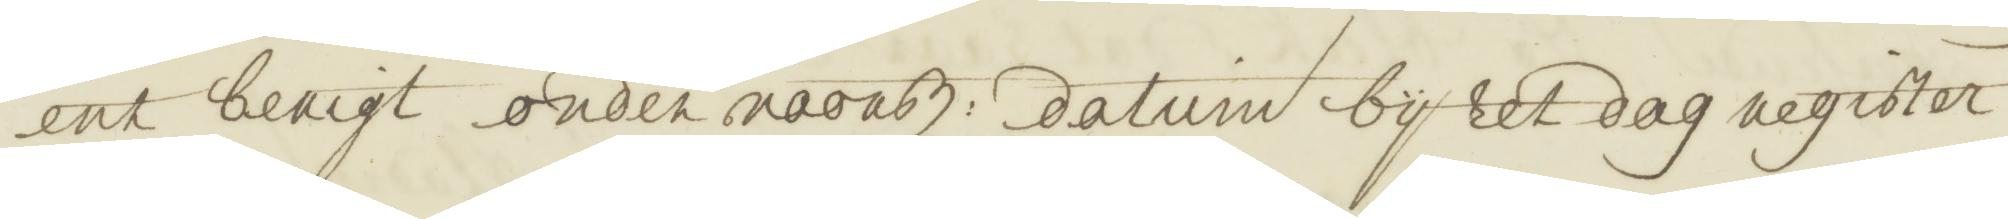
en't berigt onder voorsz: datum bij het dag register
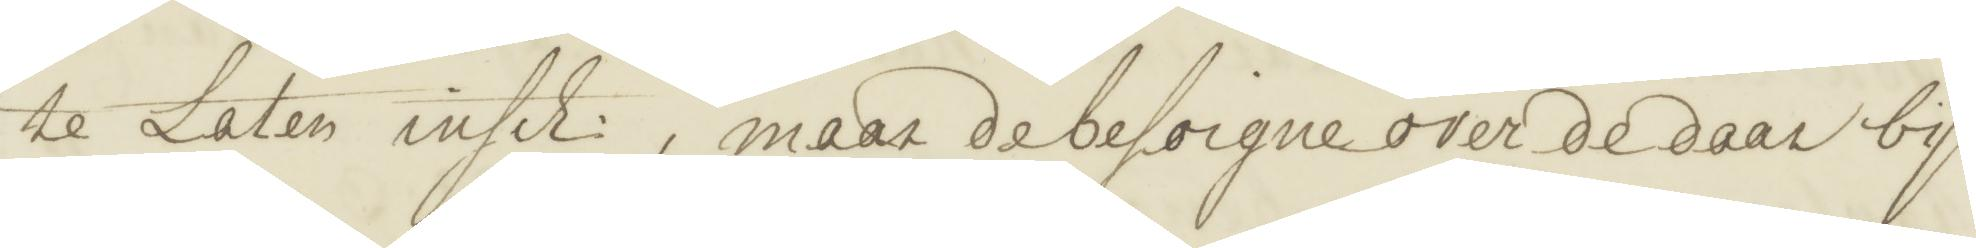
te laten insch:, maar de besoigne over de daar bij
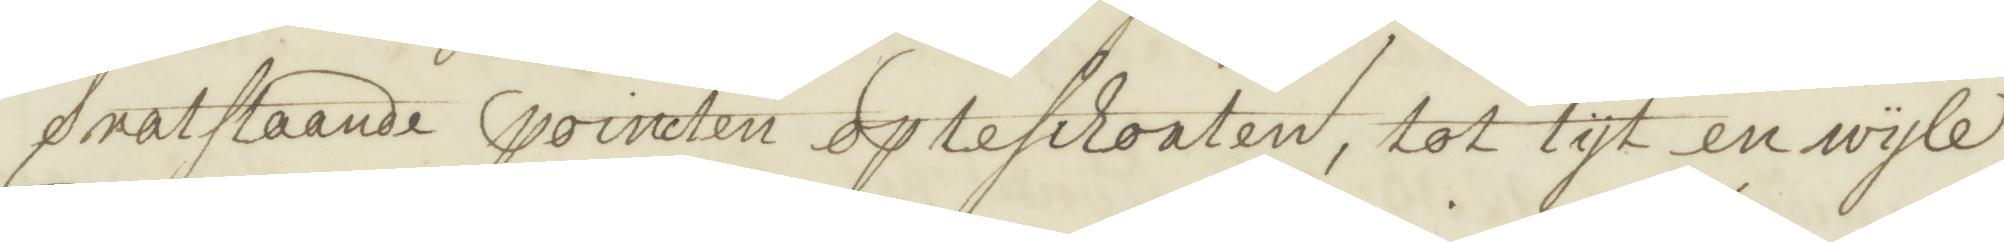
vervat staande poincten op teschorten, tot tijt en wijle
